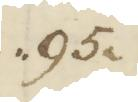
„95.
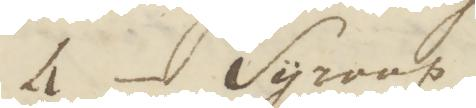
4 — Sijroop
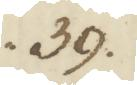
„39.
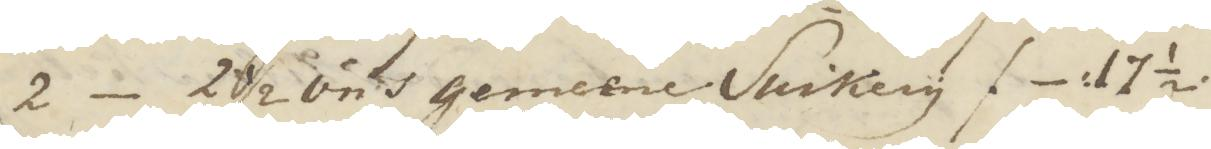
2 — 2½ ons gemeene Suikerij ƒ —:17½.
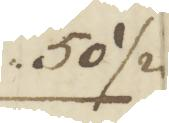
„50½
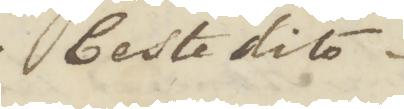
beste dito.
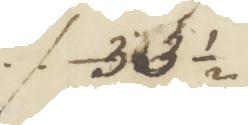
ƒ33½
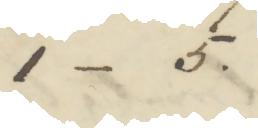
1 — 5.
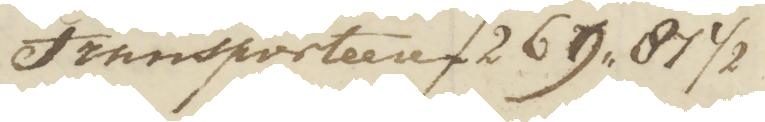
Transporteeren ƒ 269„87½
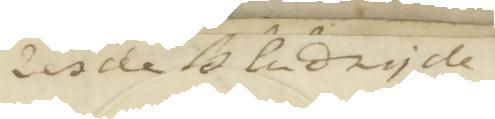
zesde bladzijde
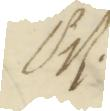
8s.
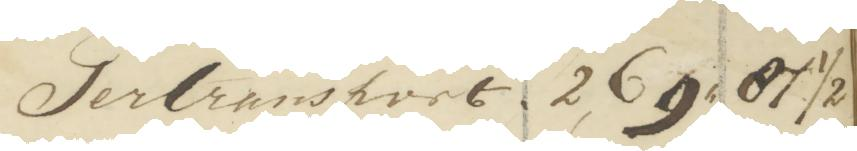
Pertransport ƒ269„87½
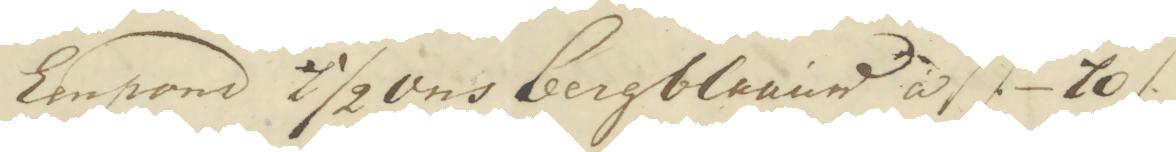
Een pond 7½ ons bergblaauw à ƒ—70 /. ƒ 1„22½
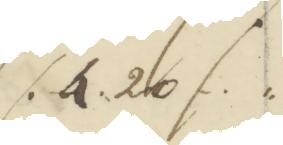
ƒ4.26. . „ 2„10.
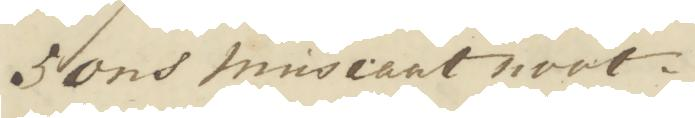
5 ons muscaat noot-
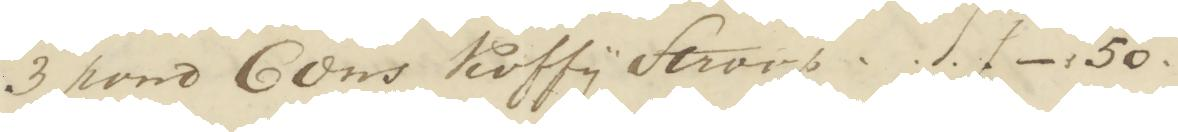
3 pond 6ons Koffij stroop . . . ƒ —:50. „ 1„80.
